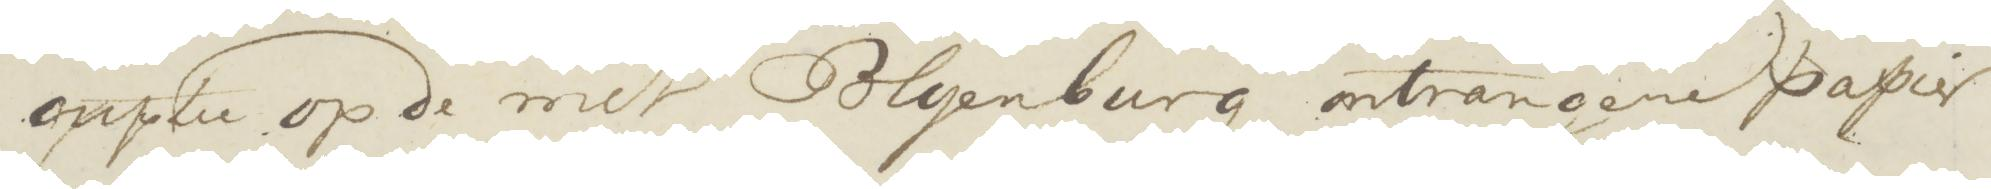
anptie op de met Blyenburg ontvangene papier
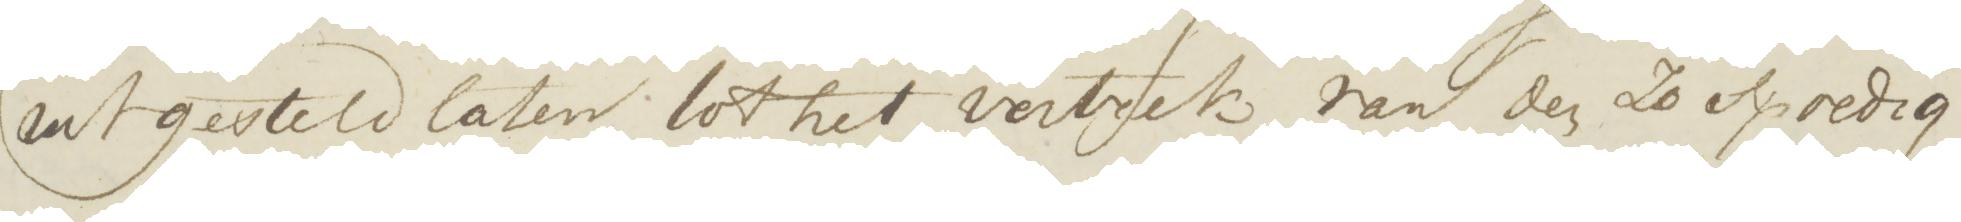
uitgesteld laten tot het vertrek van den zo spoedig
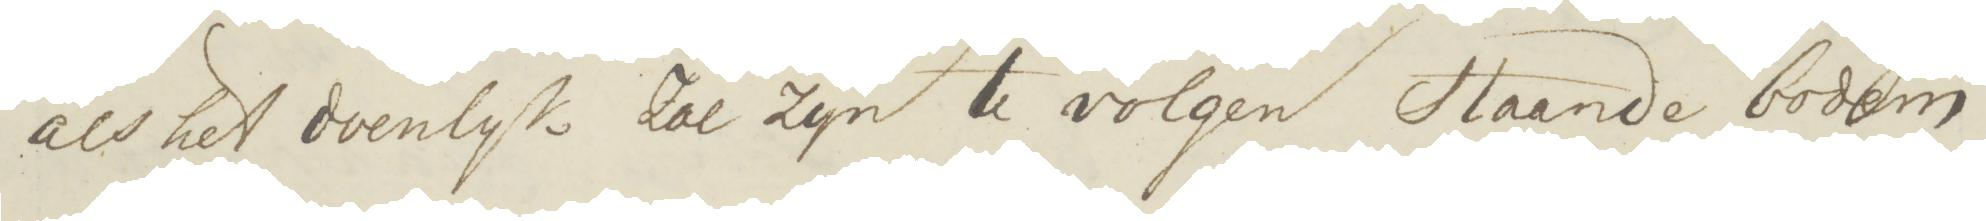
als het doenlyk zal zyn te volgen staande bodem
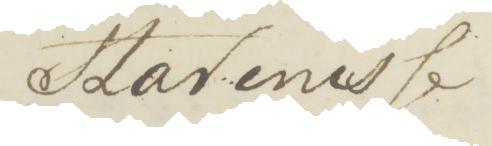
Stavenisse
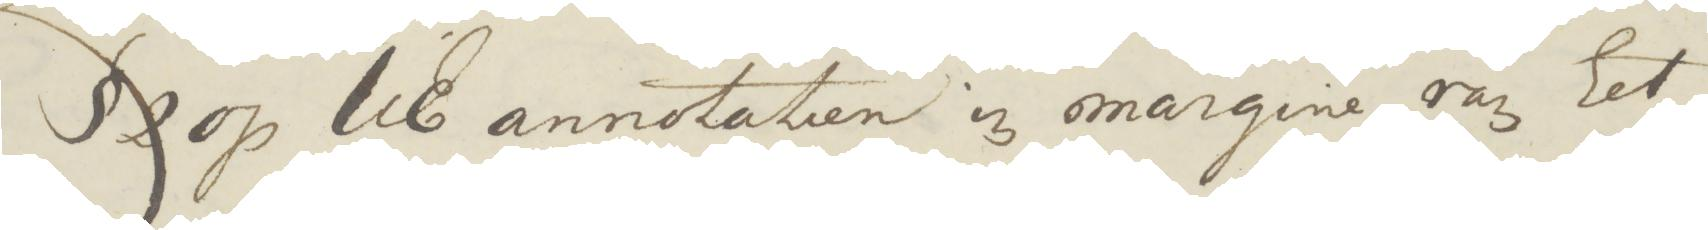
§ 2 op uE annotatien in margine van het
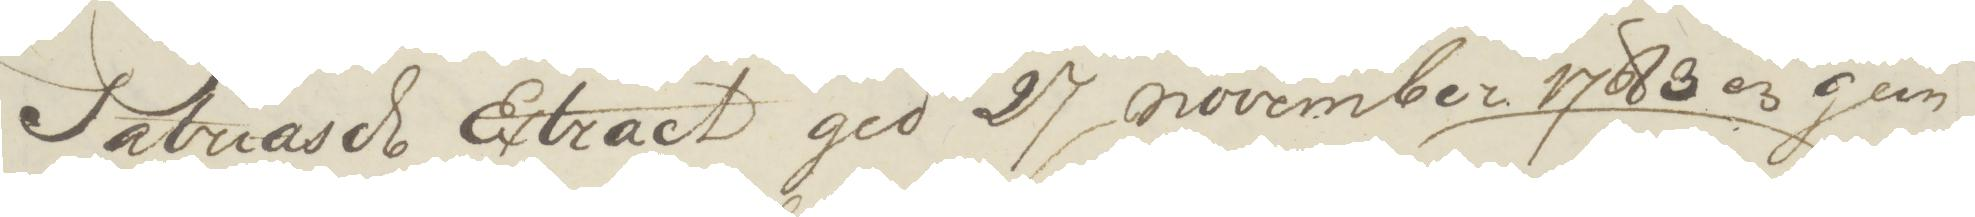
Satriasch Extract ged 27 november 1783 en gein
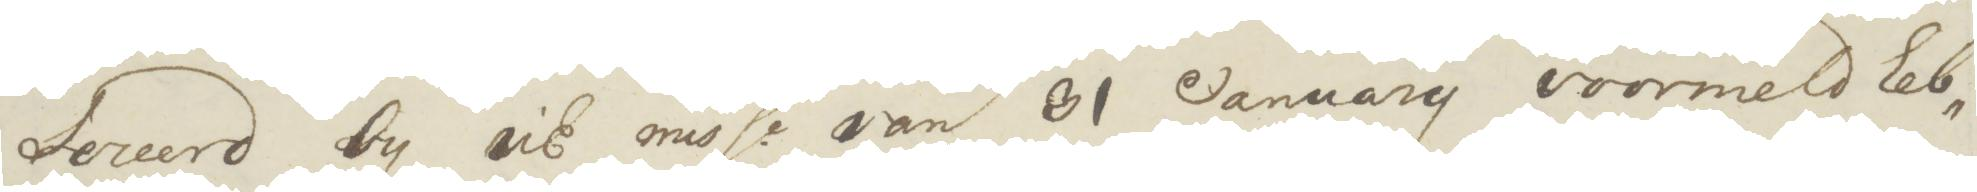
sereerd by uE miss.e van 31 Januarij voormeld heb„
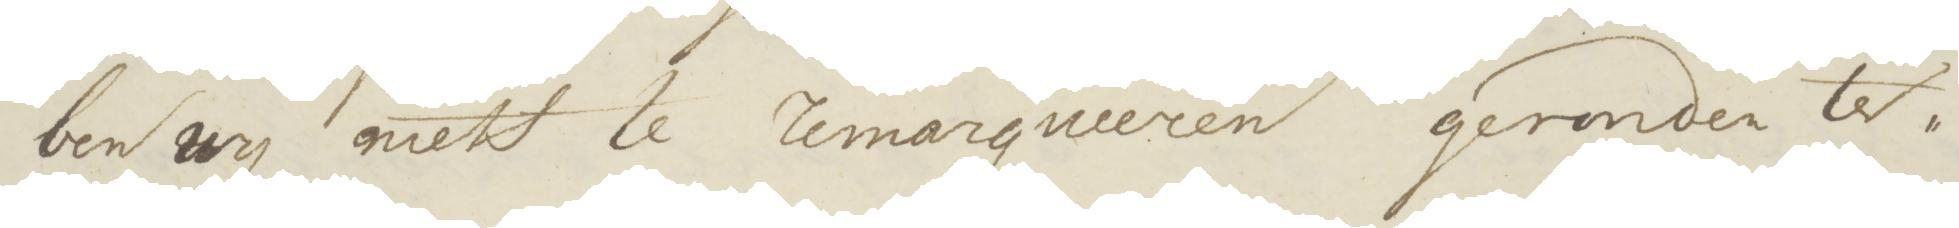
ben wy niets te remarqueeren gevonder ter„
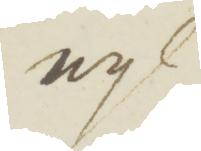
wyl
